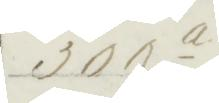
309=a
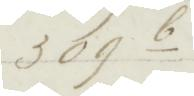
309=b
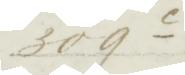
309=c
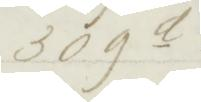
309=d
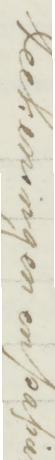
teekeningen enpapier
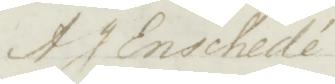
A: J Enschedé
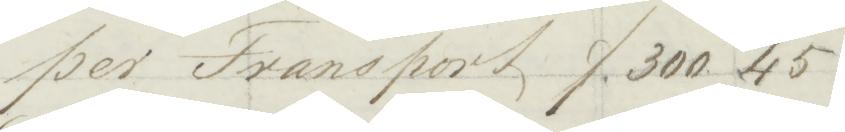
Per Transport ƒ 300. 45
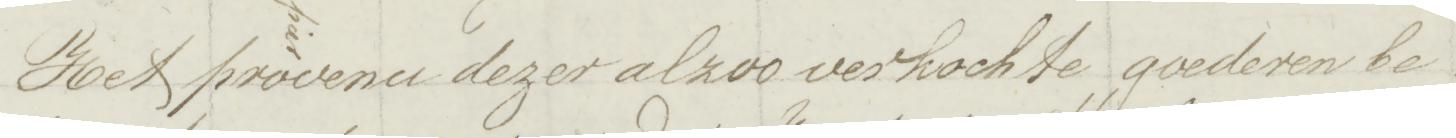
Het provena dezer alzoo verkochte goederen be
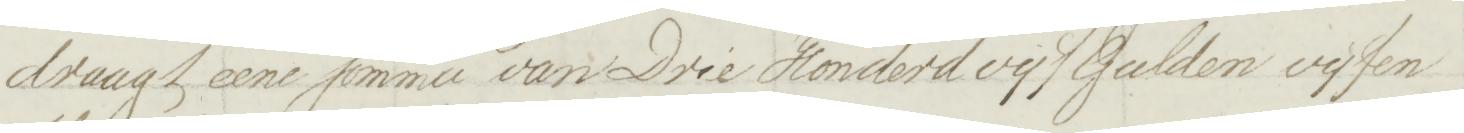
draagt eene somma van Drie Honderd vijf Gulden vijfen
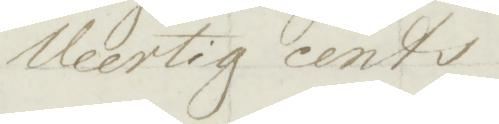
Veertig cents
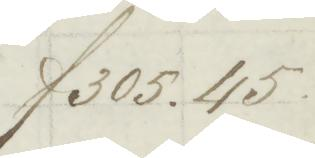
ƒ305. 45.
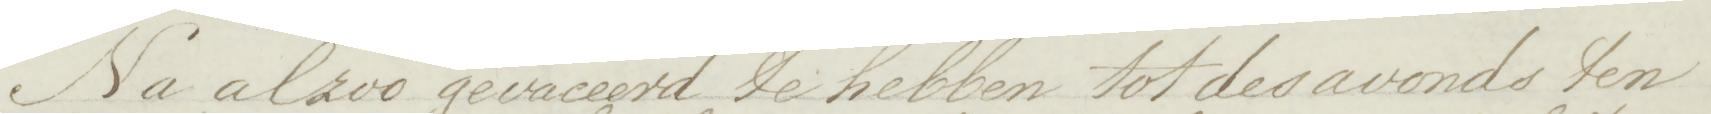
Na alzoo gevaceerd te hebben tot des avonds ten
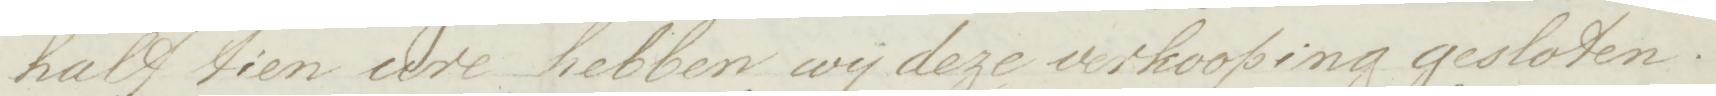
half tien ure hebben wij deze verkooping gesloten.
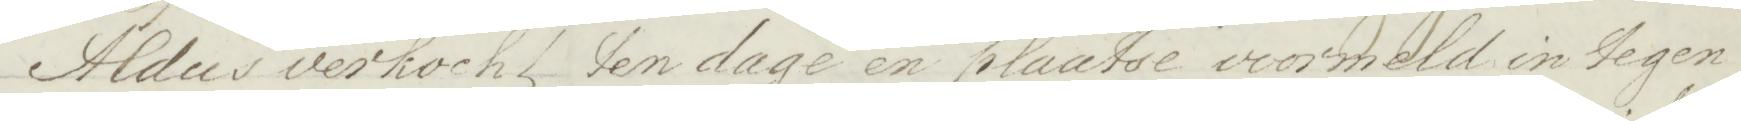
Aldus verkocht ten dage en plaatse voormeld in tegen
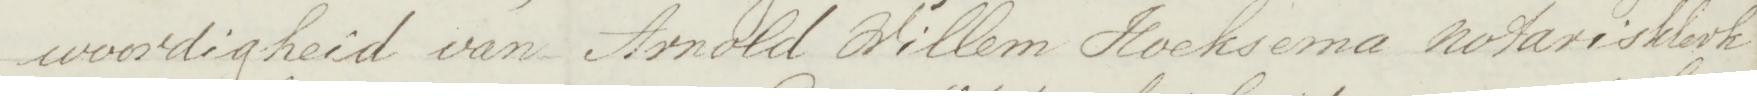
woordigheid van Arnold Willem Hoeksema notaris klerk
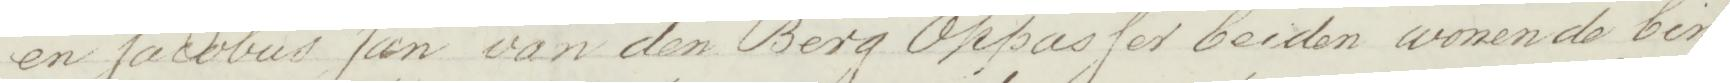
en Jacobus Jan van den Berg Oppasser beiden wonende bin
